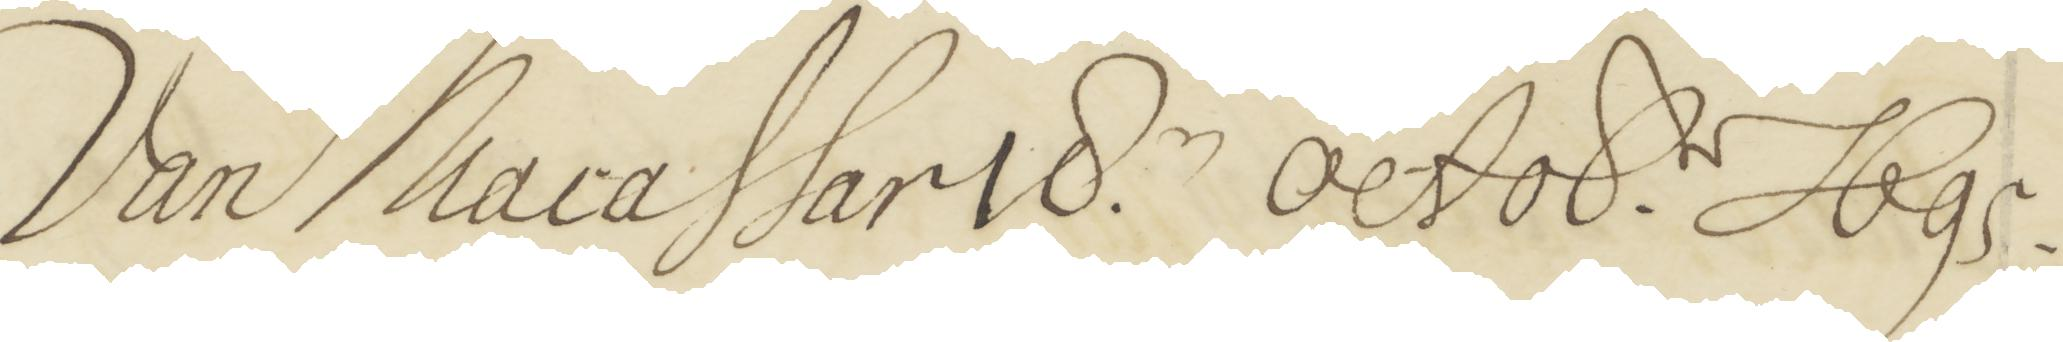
Van Macassar 18.n octob.r 1695.
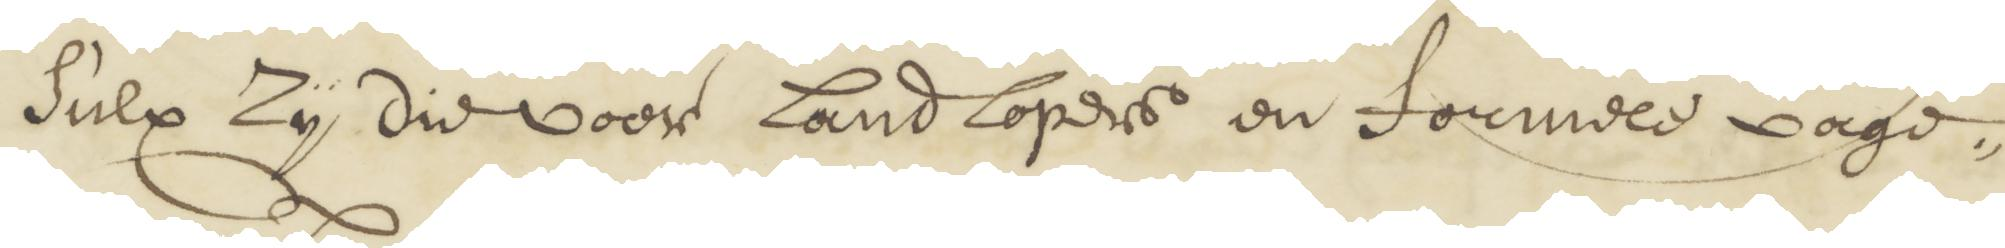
sulx zij die voor landlopers en formele vage„
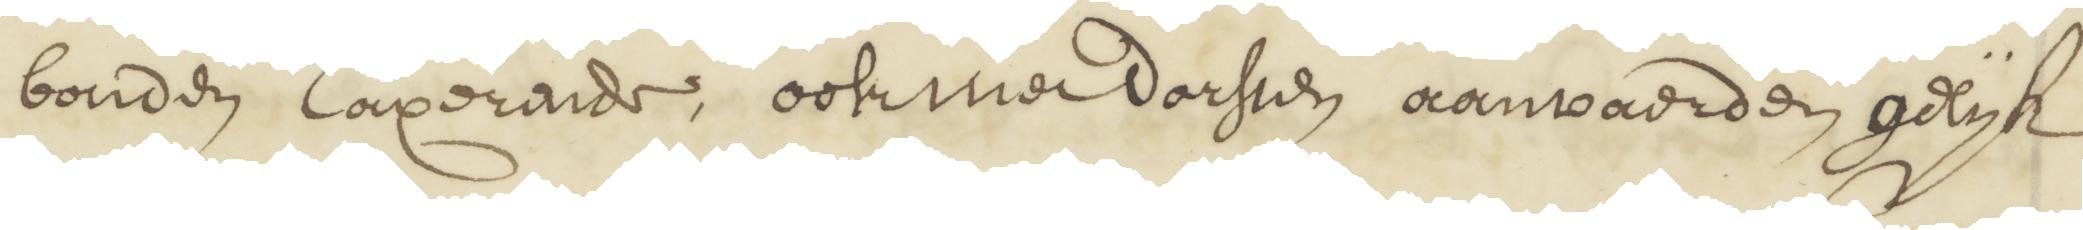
bonden Taxerende, ook niet dorsten aanvaerden gelijk
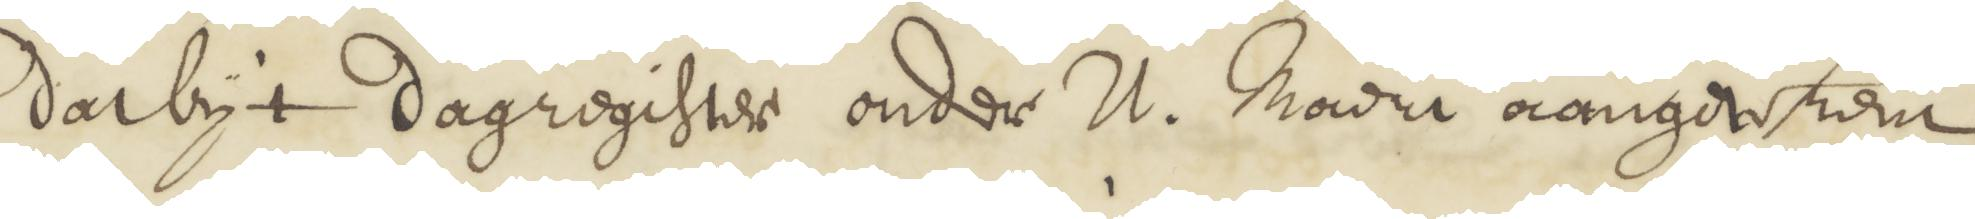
dat bij ’t dagregister onder 21. Maert aangetekent
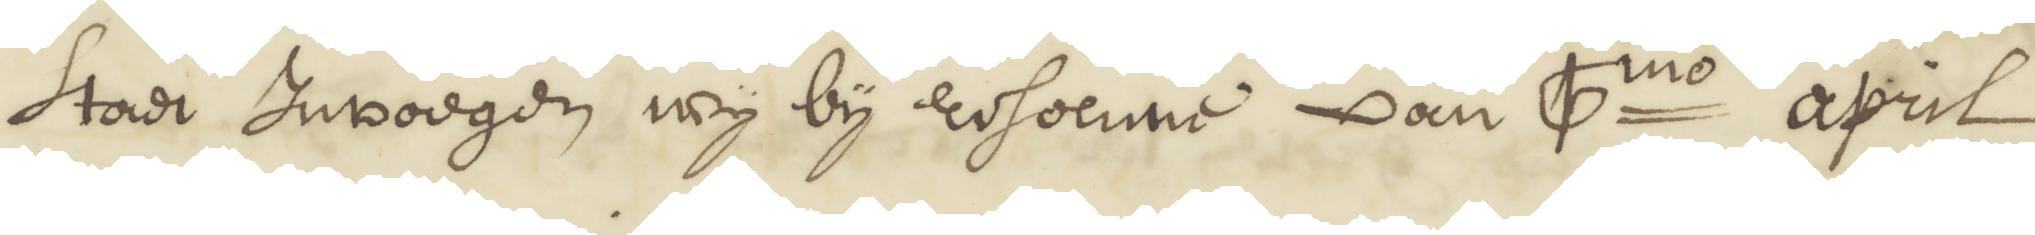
staet Invoegen wij bij resolutie van p=mo april
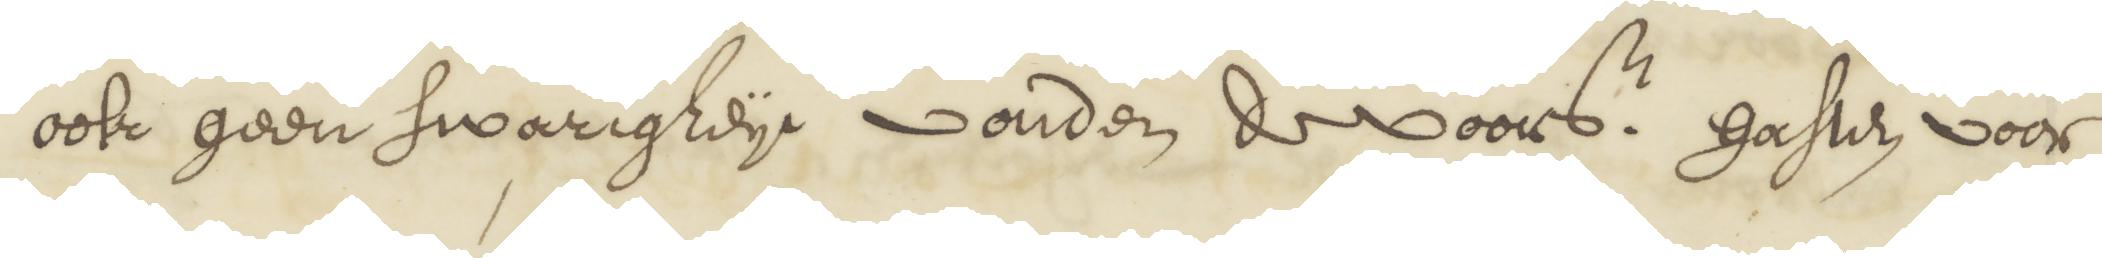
ook geen swarigheijt vonden de voors. gasten voor
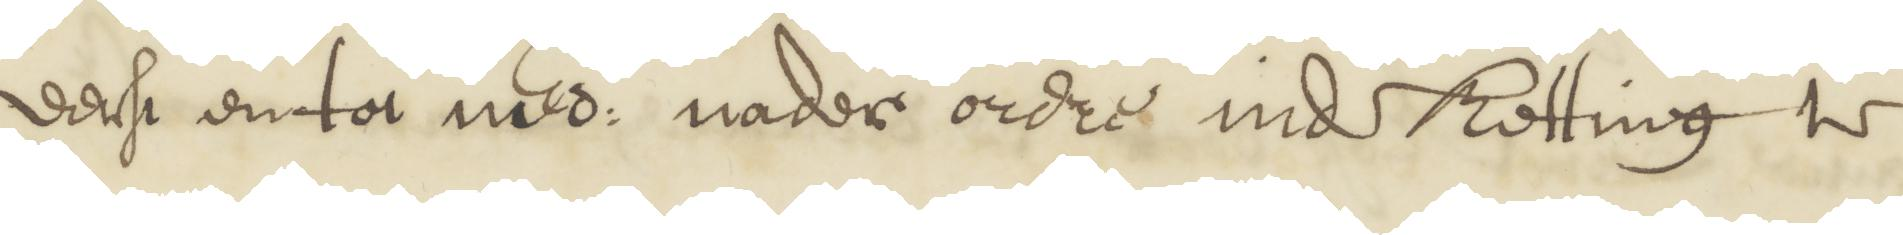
eerst en tot uEd: nader ordre inde ketting te
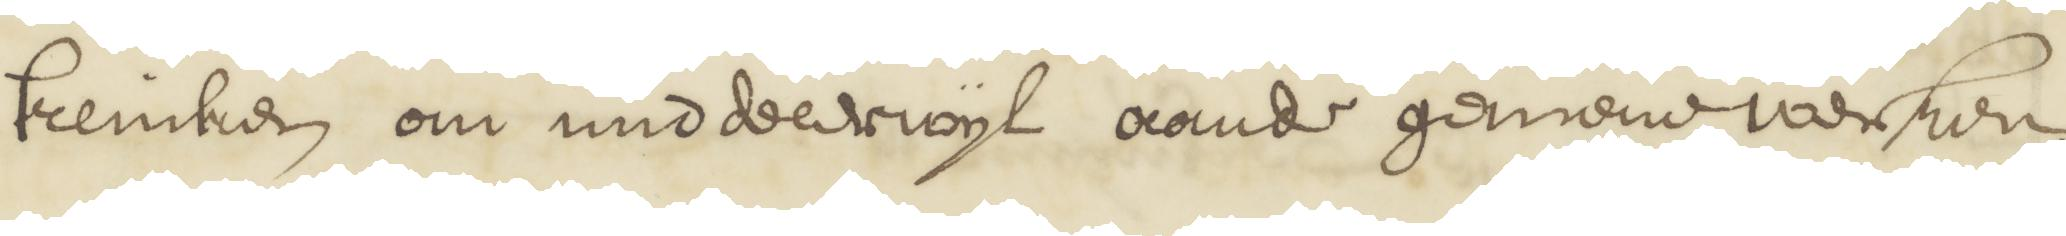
klinken om middelerwijl aande gemene werken,
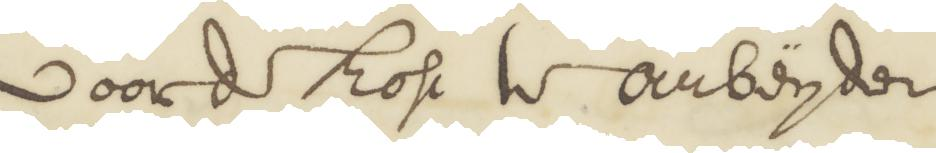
voor de kost te arbeijden
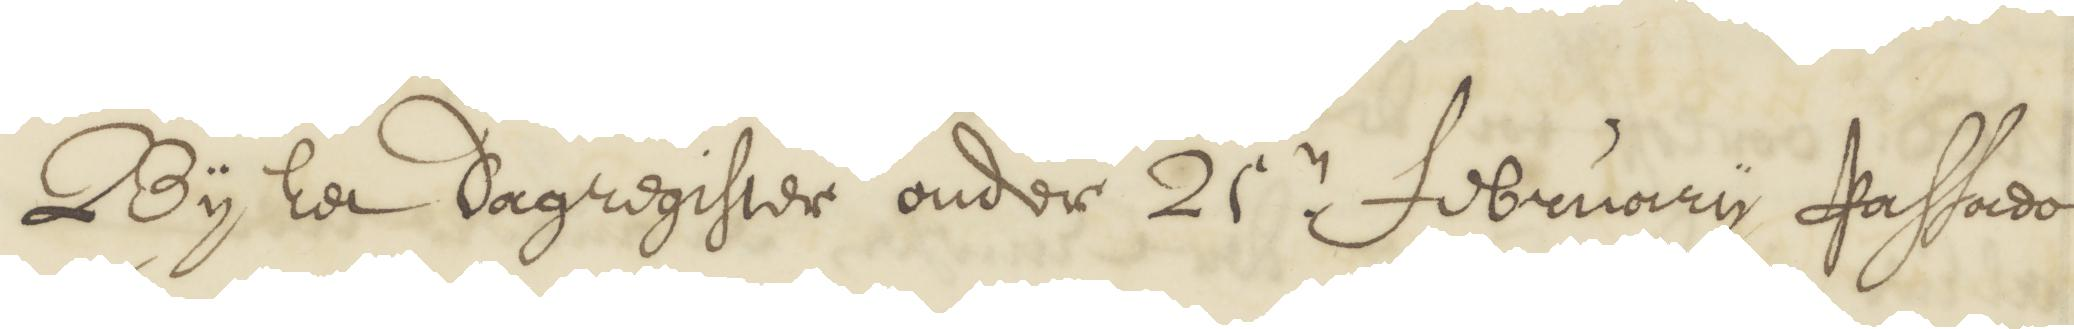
Bij het dagregister onder 25.n Februarij passado
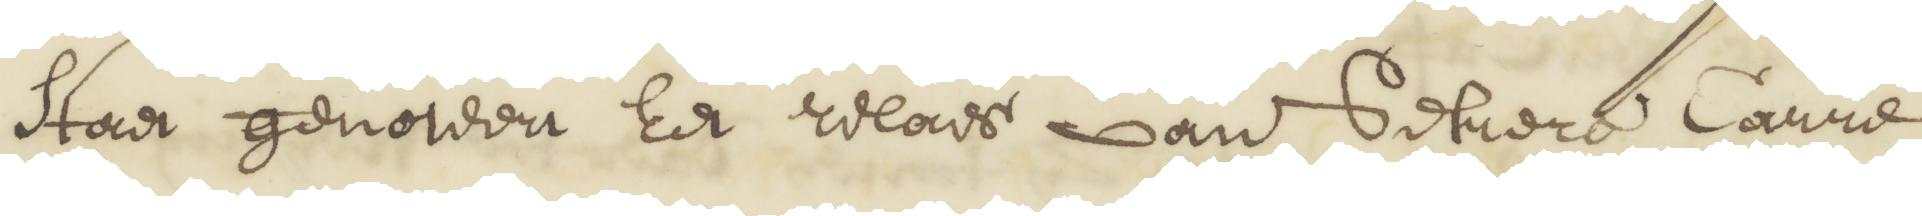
staet genoteert het relaes van sekere Carre
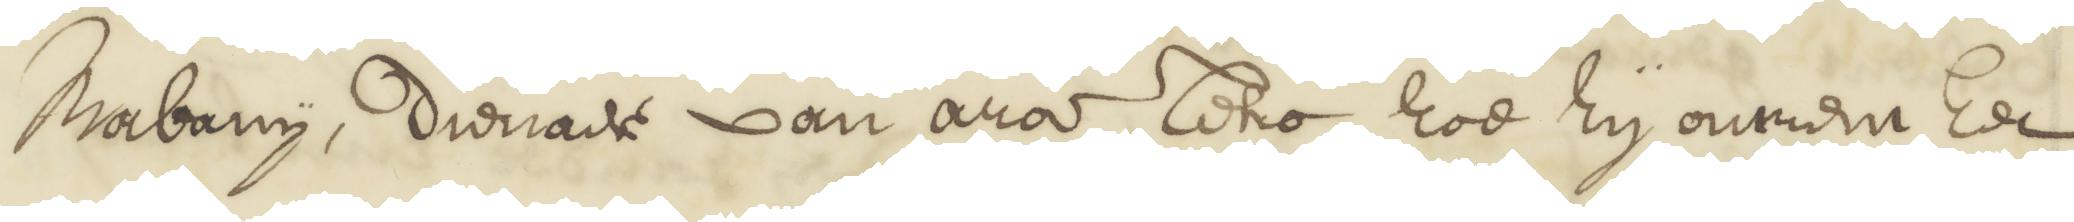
Mabanij, dienaer van aroe Teko, hoe hij ontrent het
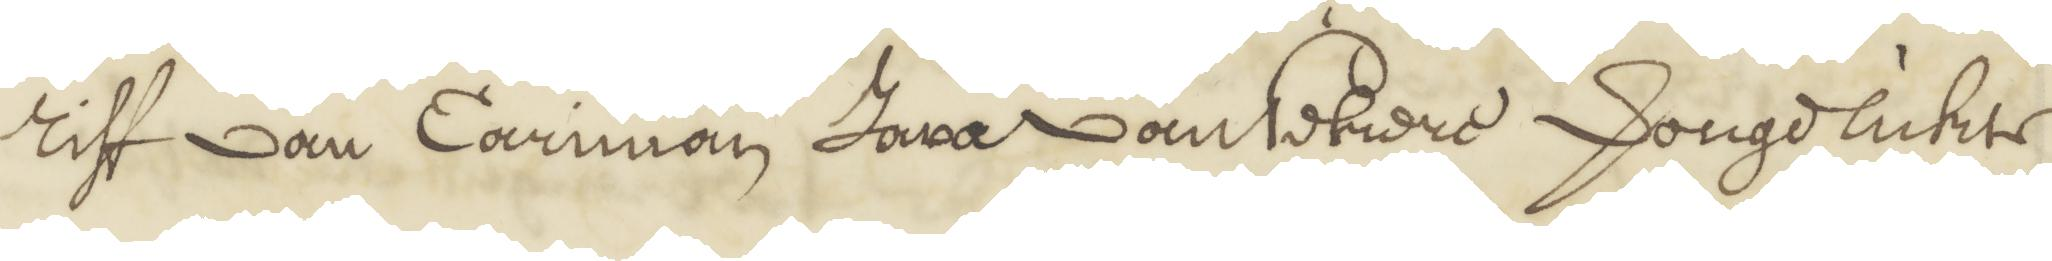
riff van Cariman Java van sekere verongelukte
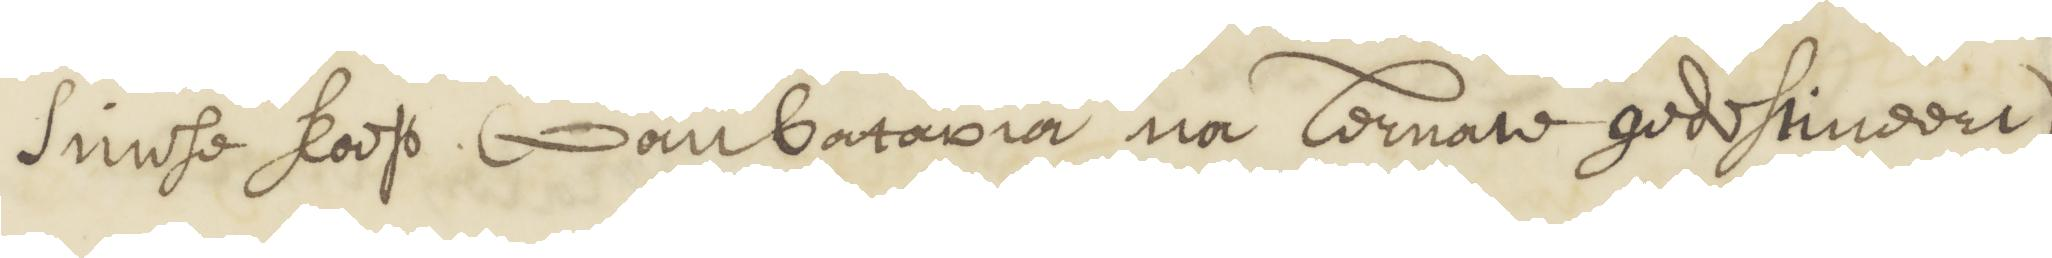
sinese sloep van batavia na Ternate gedestineert
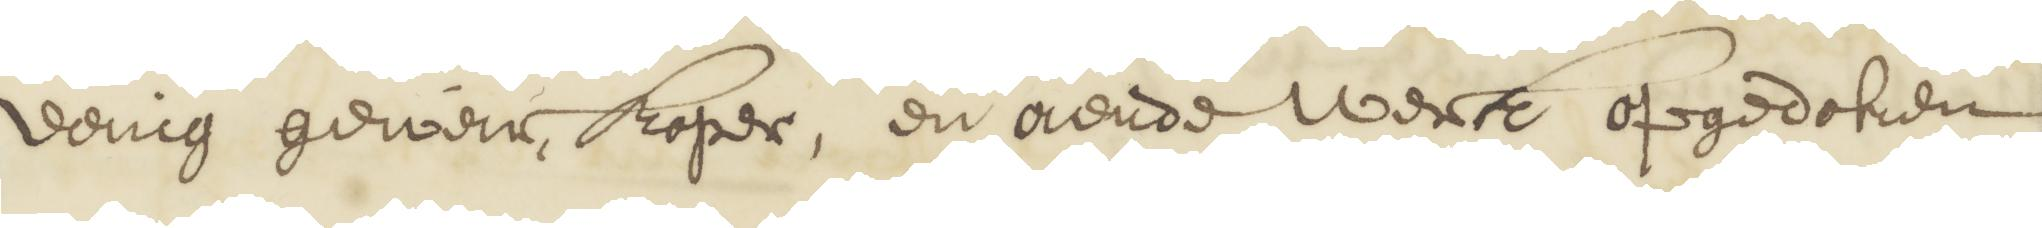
eenig geweir, koper, en aerdewerk opgedoken
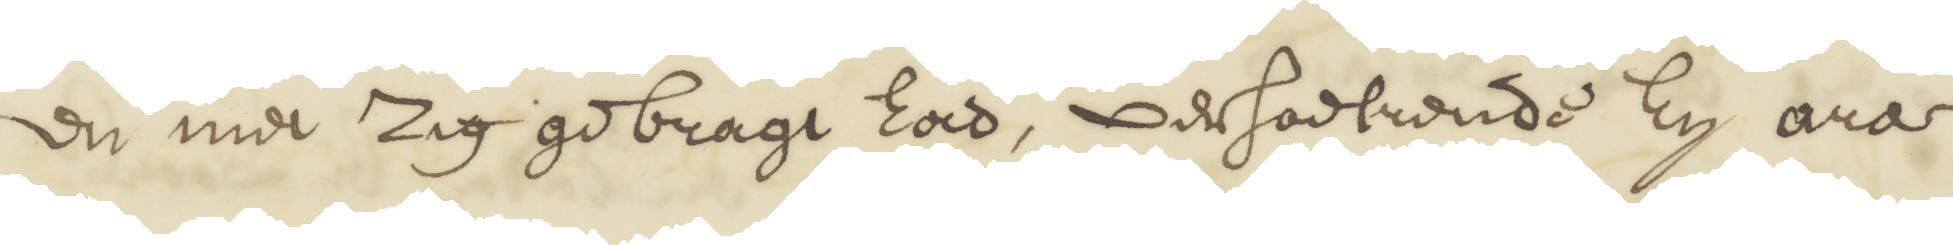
en met zig gebragt had, versoekende hy aroe
